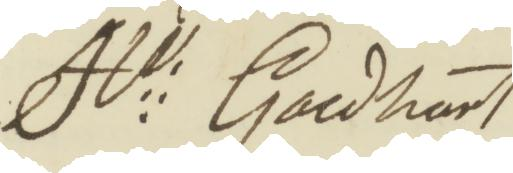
H:k: Goedhart
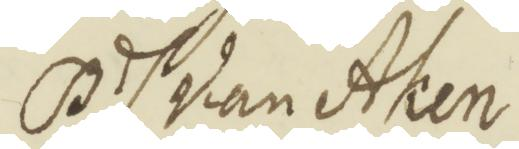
PJ Van Aken
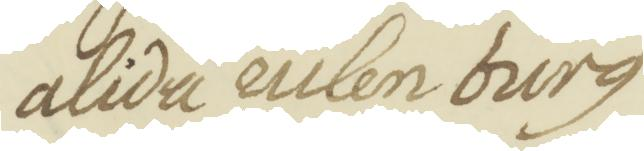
alida uilenburg
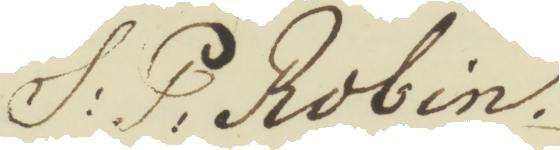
S: F: Robin.
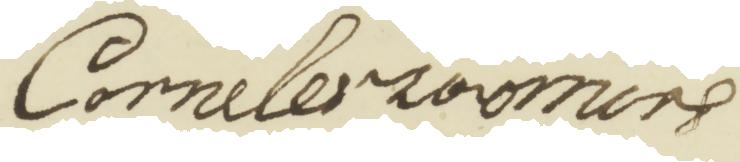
Corneles zoomers
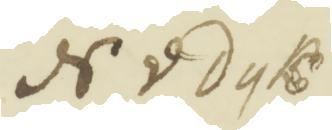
N v dyk
